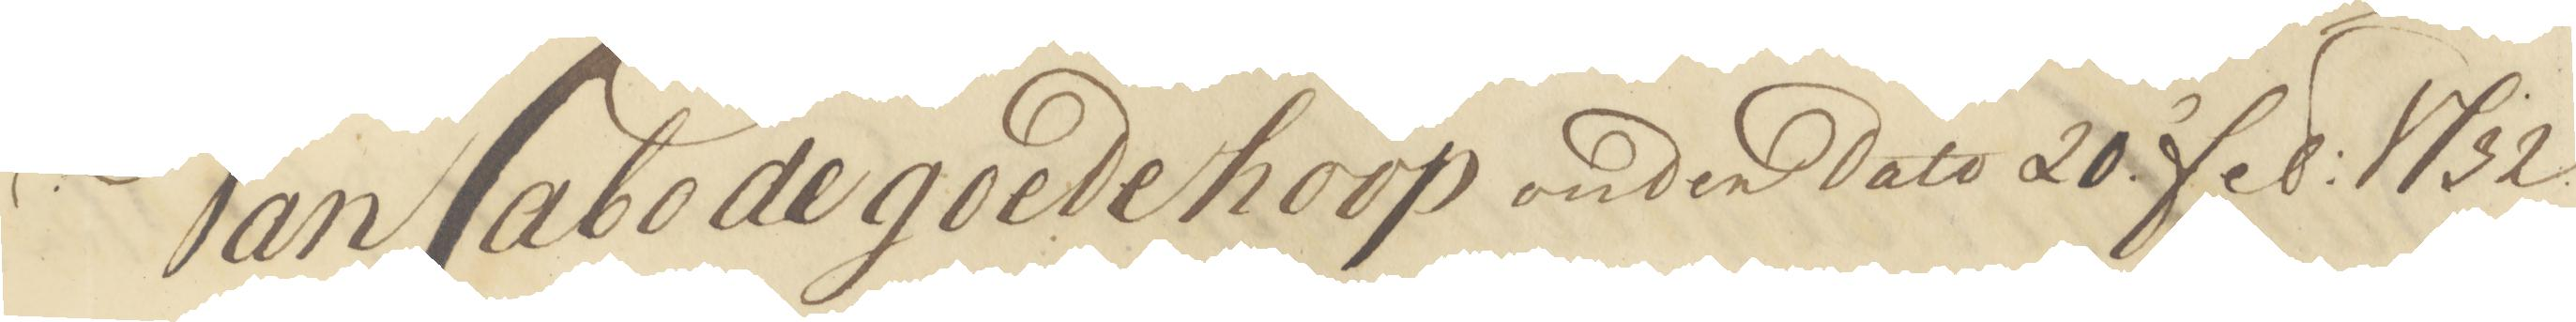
Van Cabo de goede hoop onder dato 20.' feb: 1732
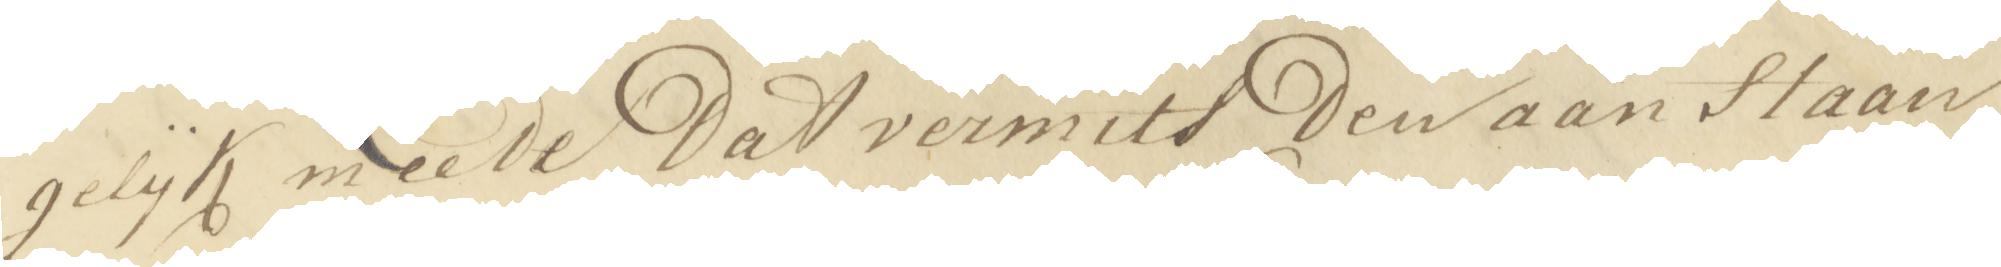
gelijk meede dat vermits den aanstaan
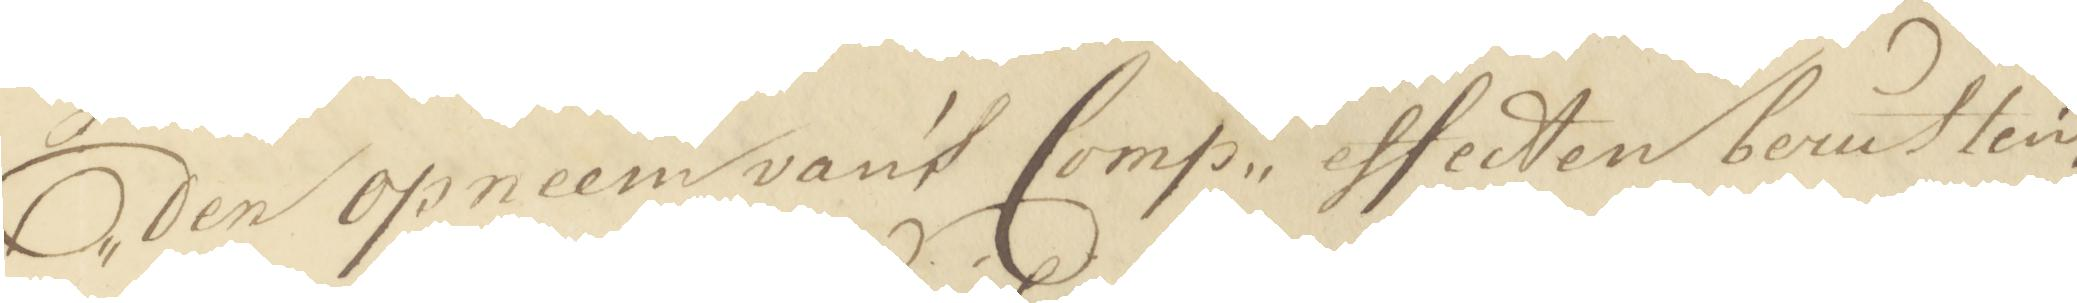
den opneem van ’s Comp„s effecten berusten
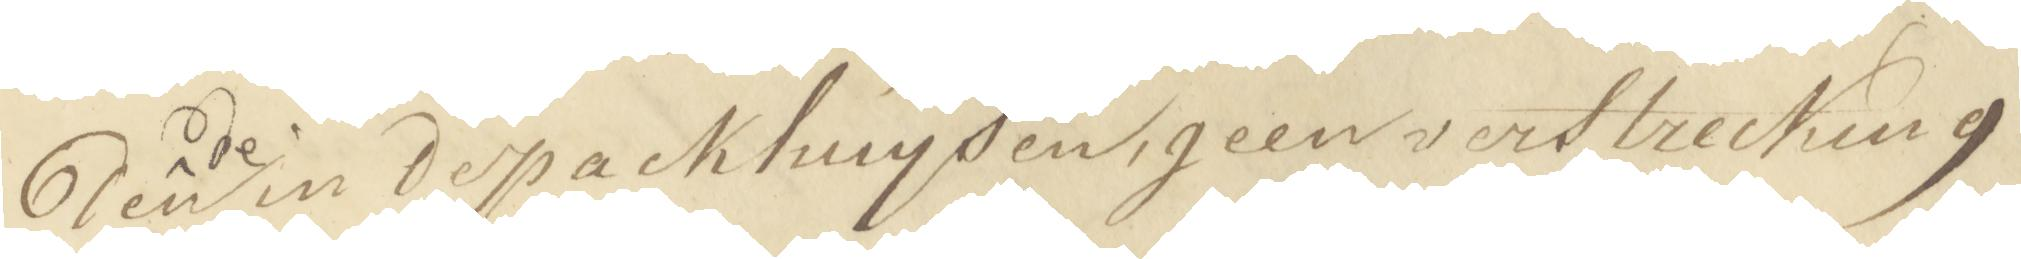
den ^ in de packhuijsen, geen verstrecking
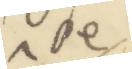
^de
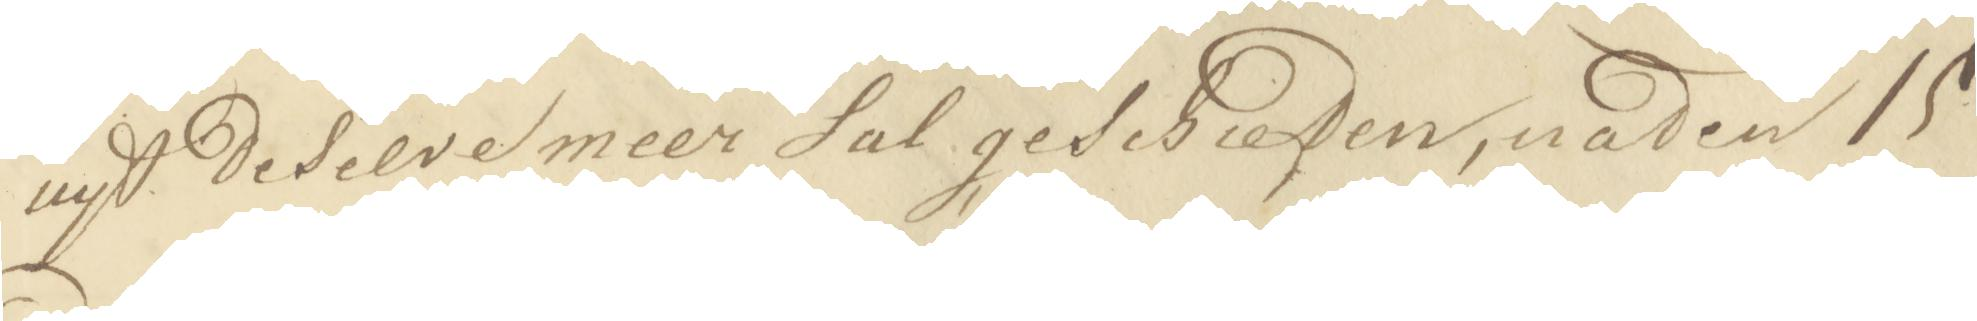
uijt deselve meer sal geschieden, na den 15
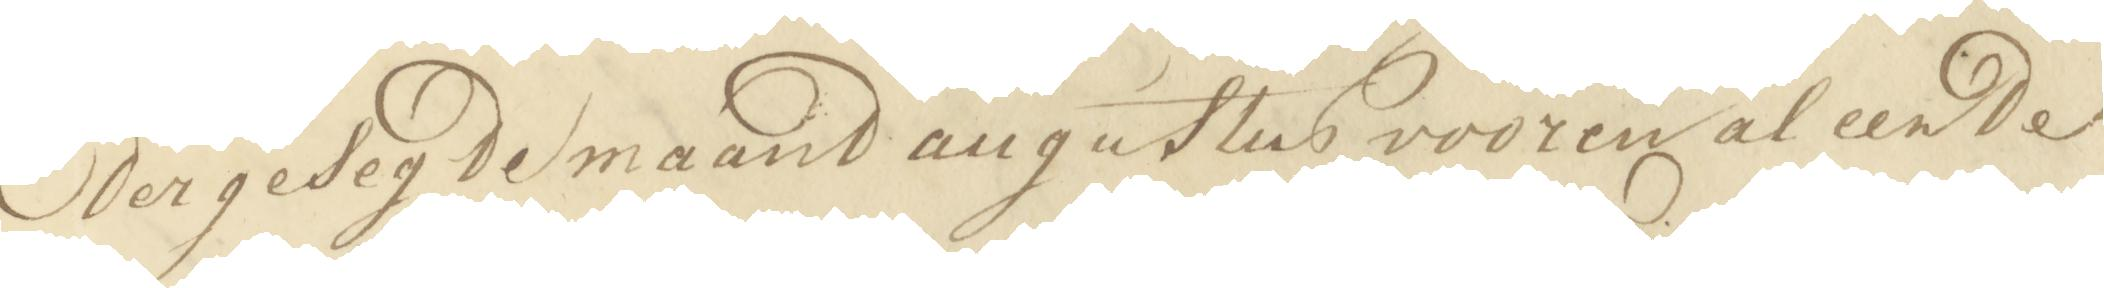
der gesegde maand augustus voor en al eer de
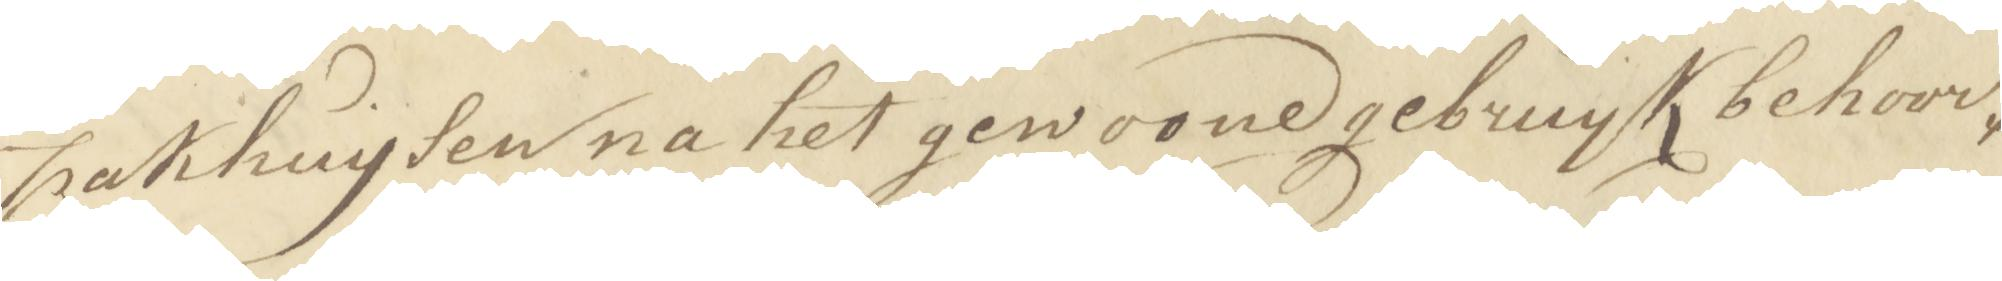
pakhuijsen na het gewoone gebruijk behoor
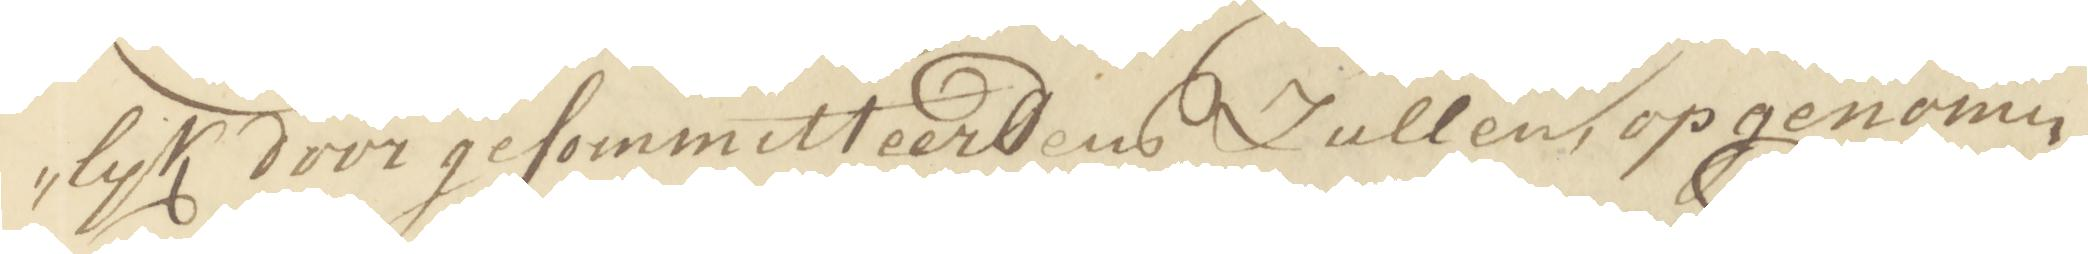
„lijk door gecommitteerdens zullen, opgenomen
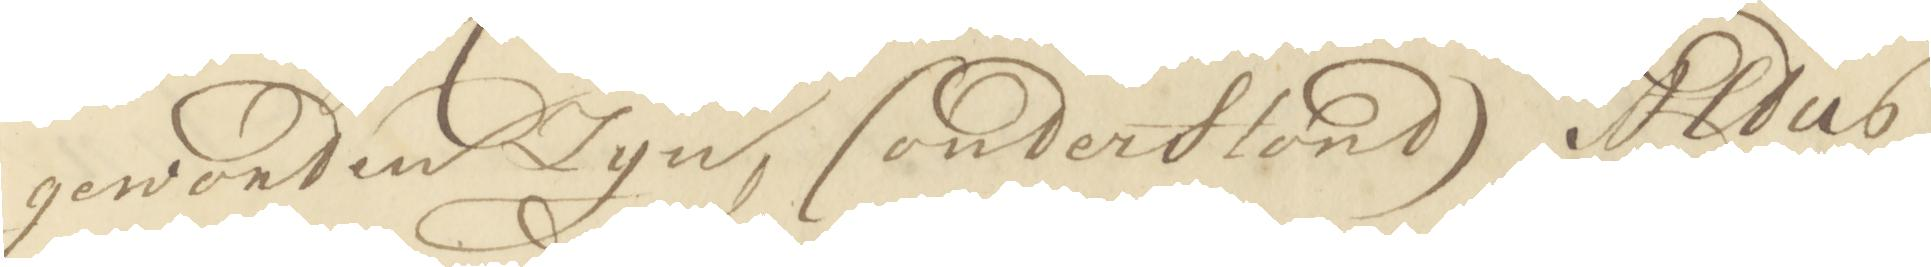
geworden zijn (onderstond) Aldus
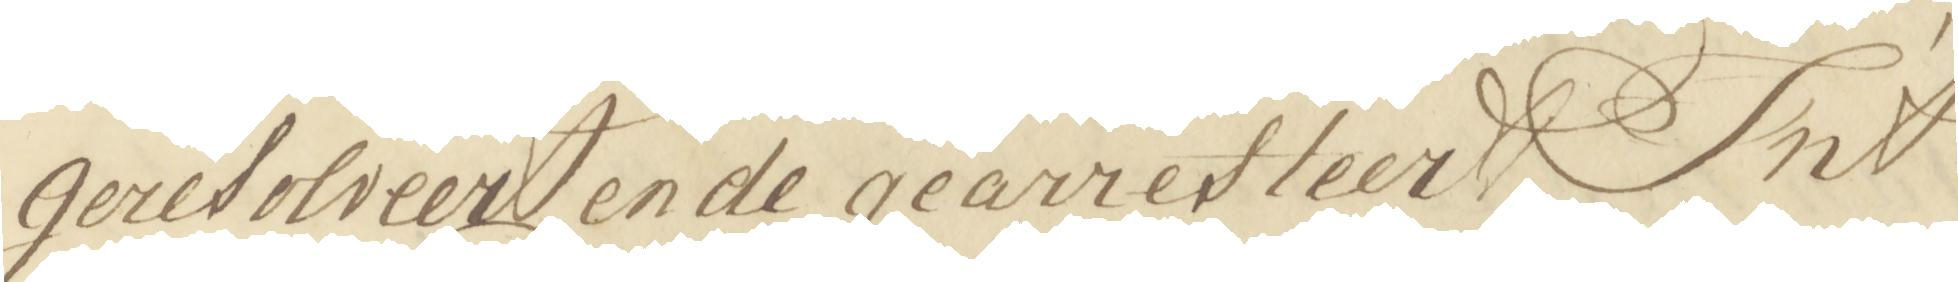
geresolveert en de gearresteert In't
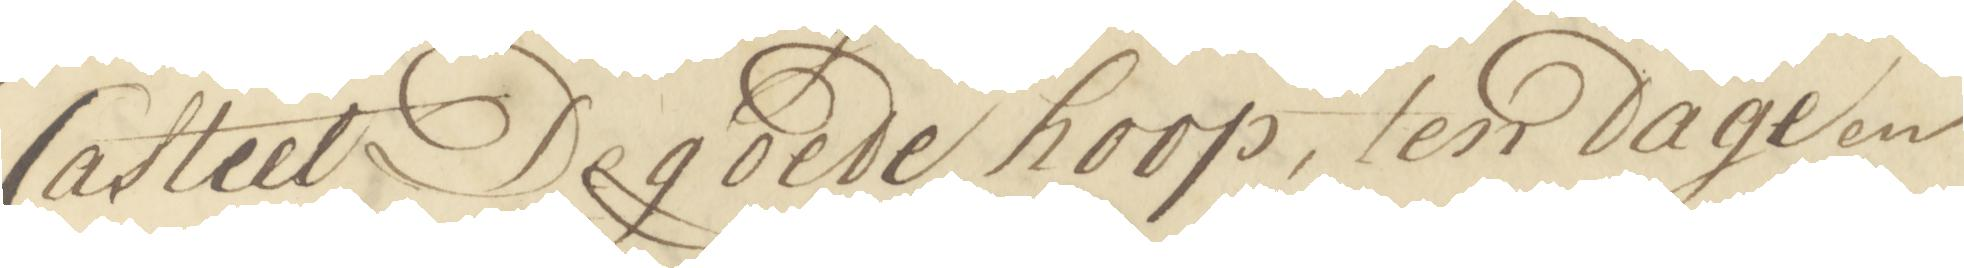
Casteel De goede hoop, ten dage en
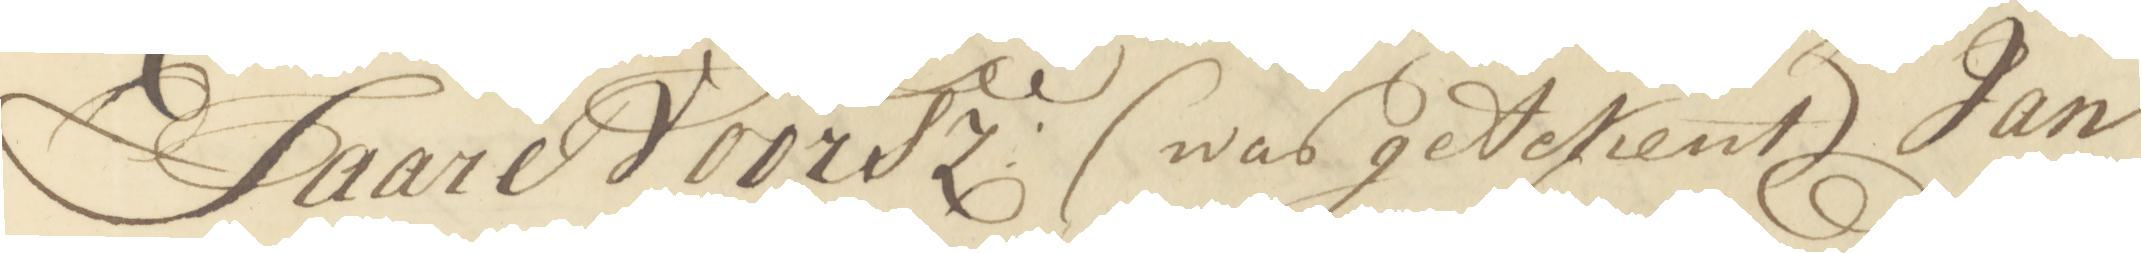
Jaare Voorsz: (was getekent) Ian
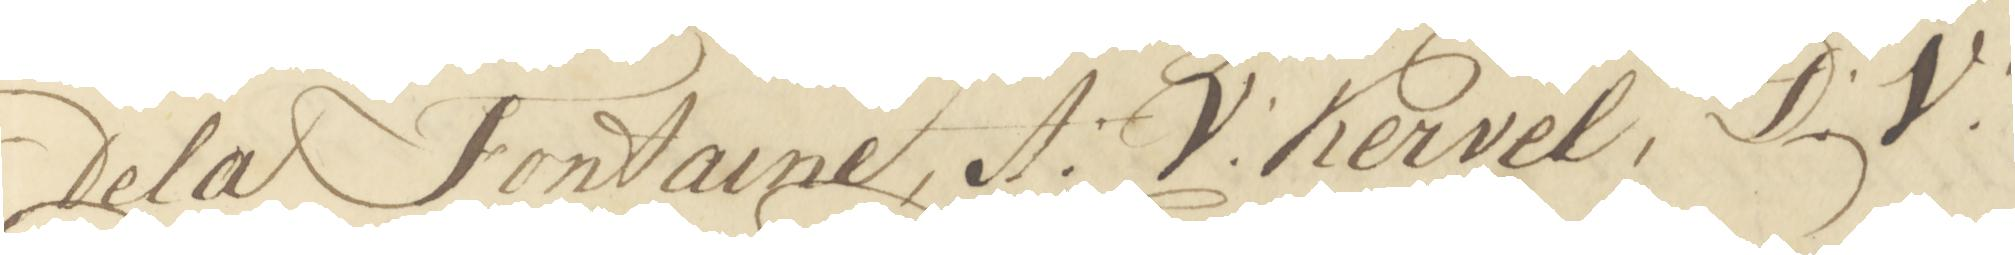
dela Fontaine, A: V: Kervel, D: V:
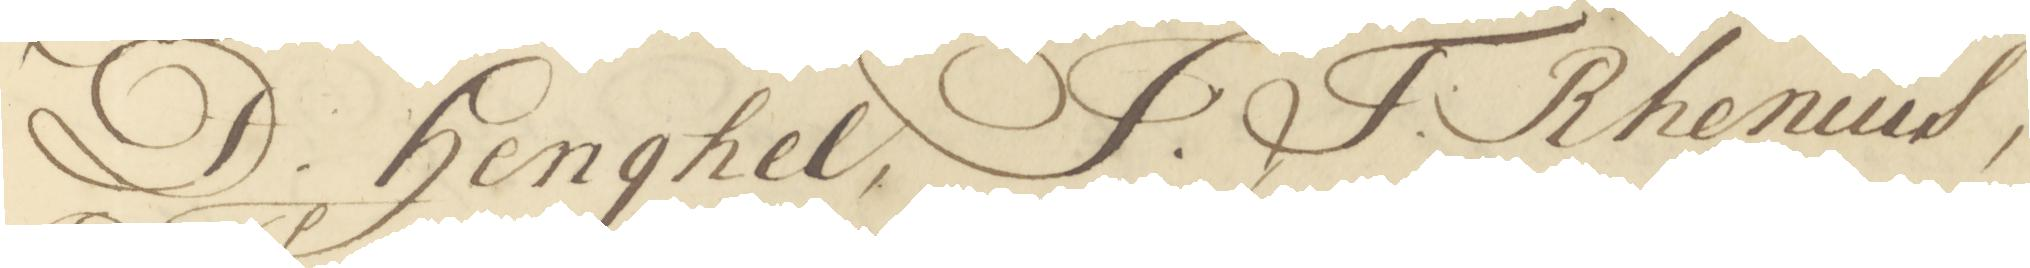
D: Henghel, I. T: Rhenius,
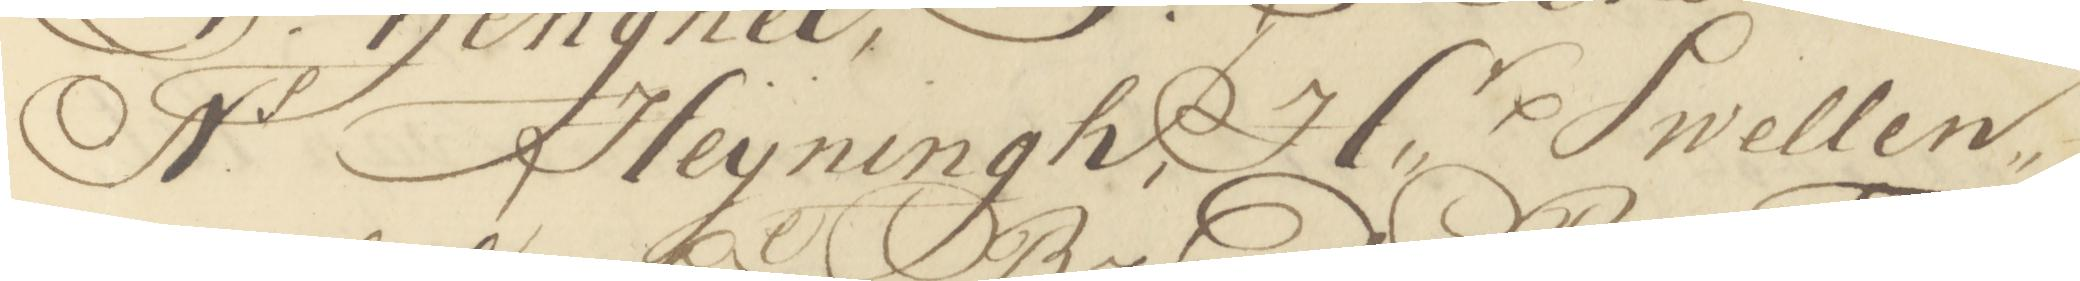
N.s Heijningh, H„k Swellen„
